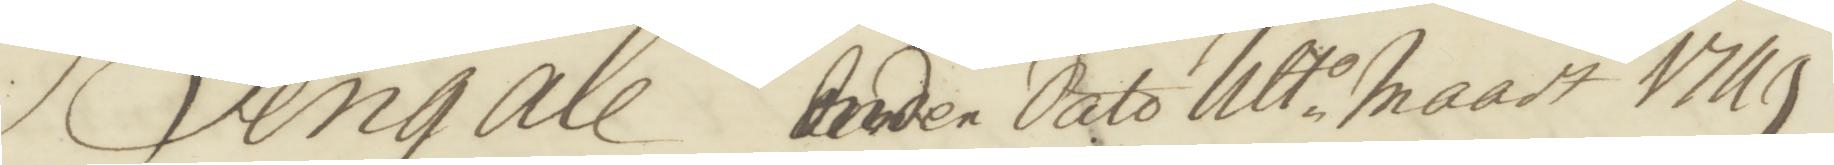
Van Bengale onder dato Ult„o maart 1749
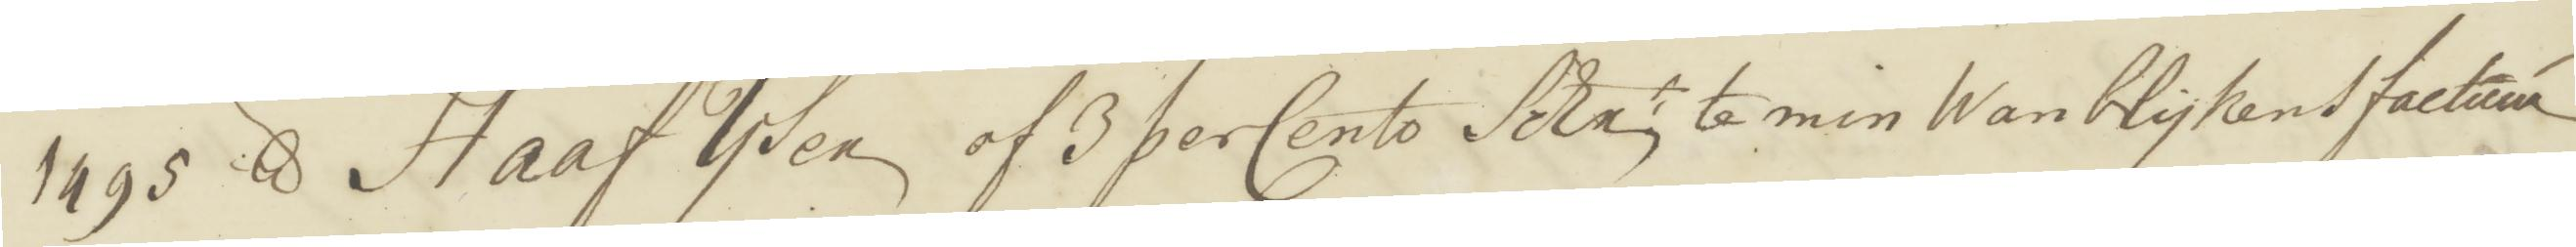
1495 lb Staaf Yser of 3 perCento schr:s te min wan blijkens factuu
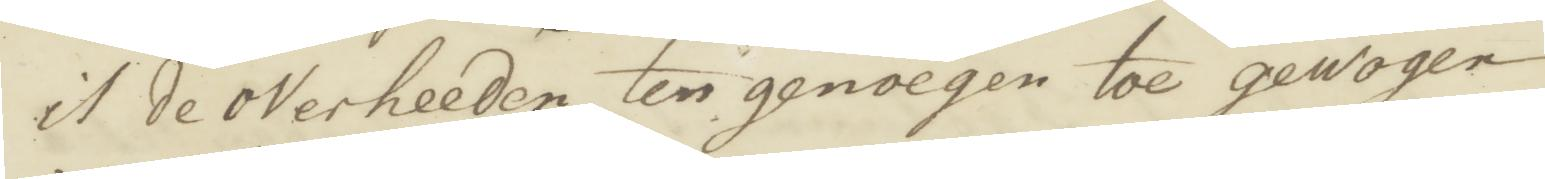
is de overheeden ten genoegen toe gewogen
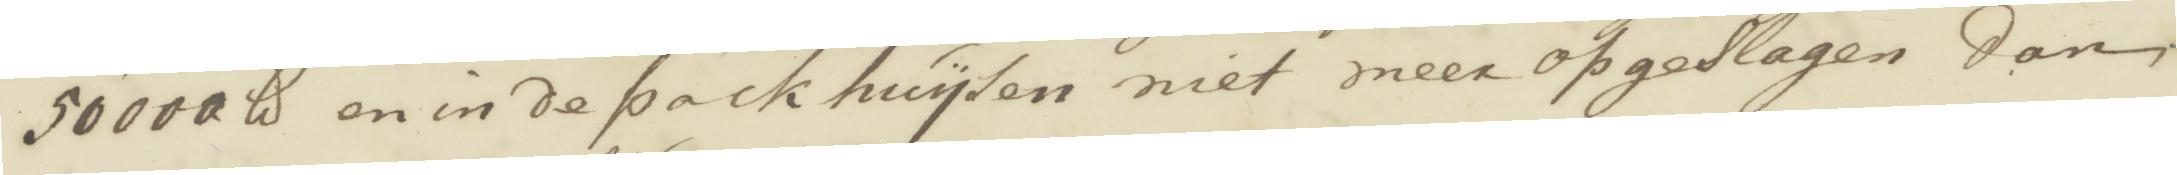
50'000 lb en in de packhuijsen niet meer opgeslagen dan
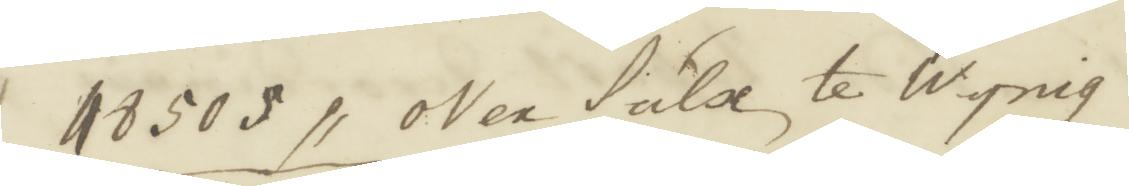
48505 „ over sulx te wynig
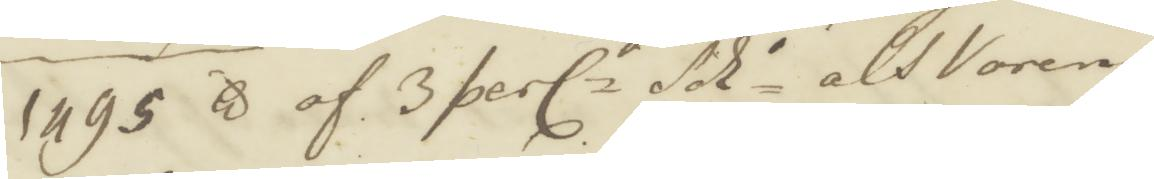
1495 lb of 3 perC=t sch=s als voren
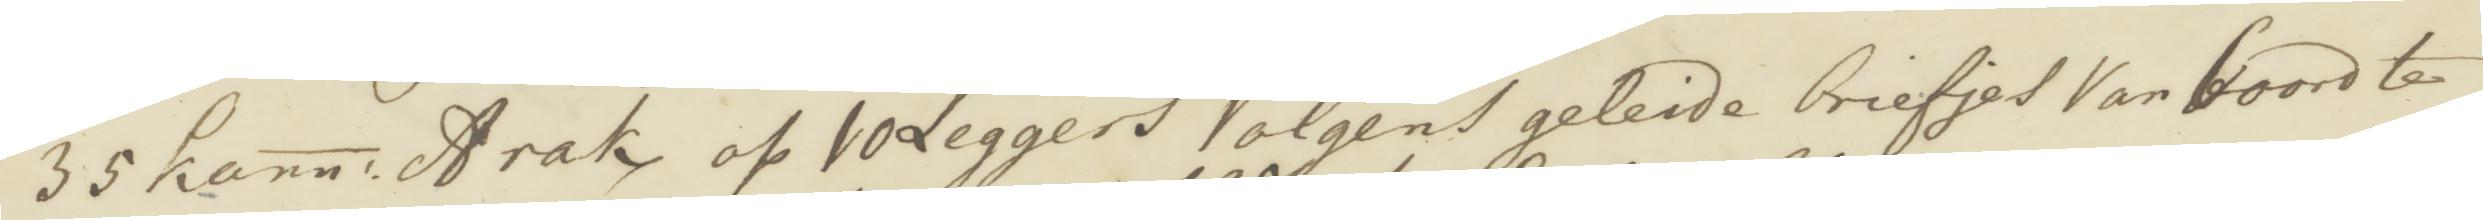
35 kann: Arak op 10 leggers volgens geleide briefjes van boord te
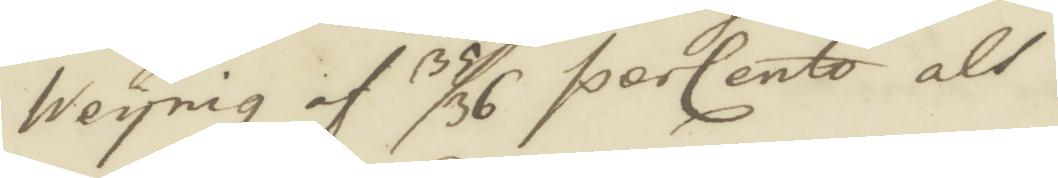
weijnig af 35/36 perCento als
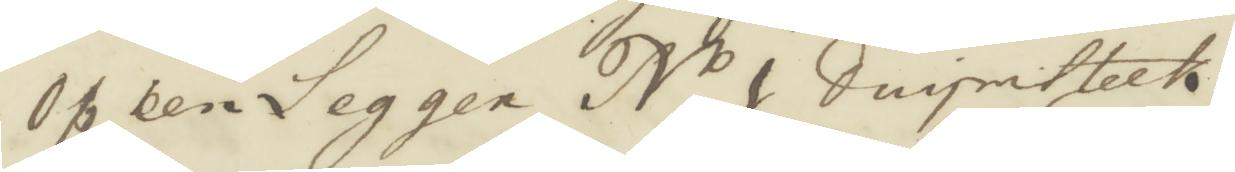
op een Legger No 1 duijmsteek
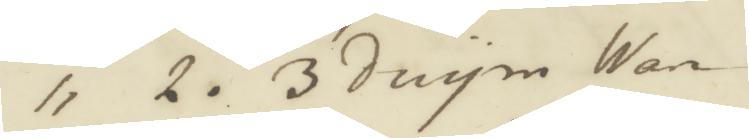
„ 2 . 3 duijm wan
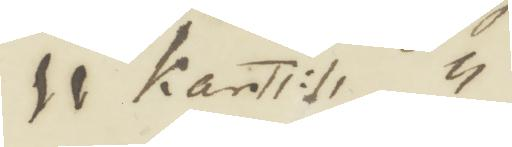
11 kan„:„ „
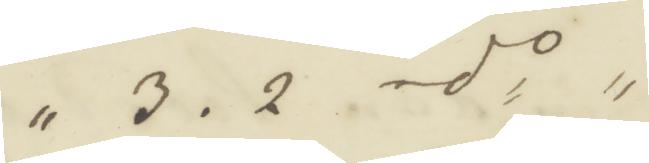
„ 3 . 2 d„o „
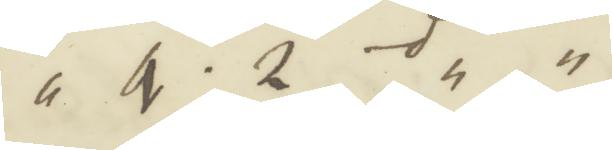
„ 4 . 2 d„o „
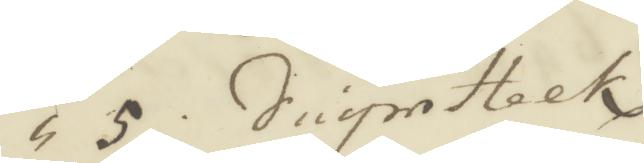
„ 5 . duijmsteek
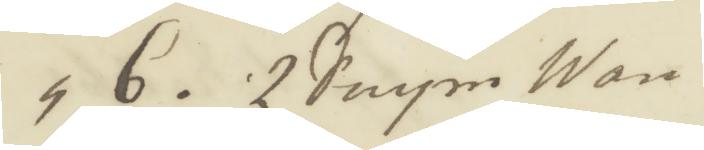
„ 6 . 2 duym wan
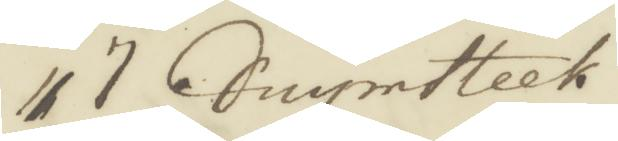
„ 7 duymsteek
